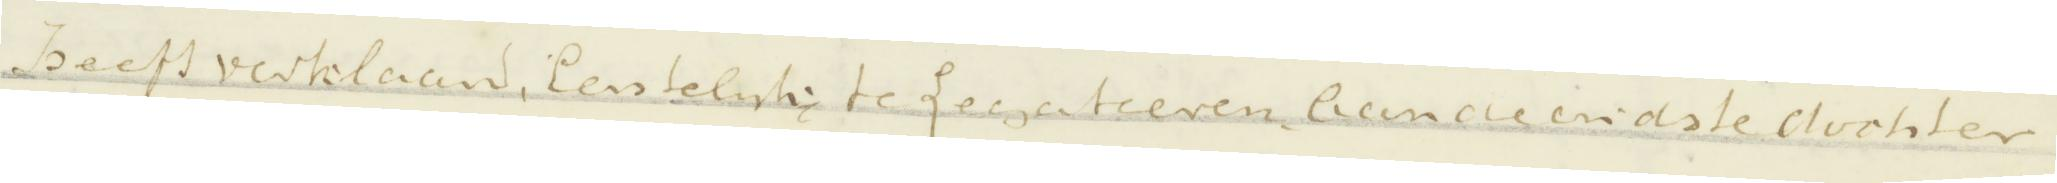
heeft verklaard, Eerstelyk te Legateeren Aan de oudste dochter
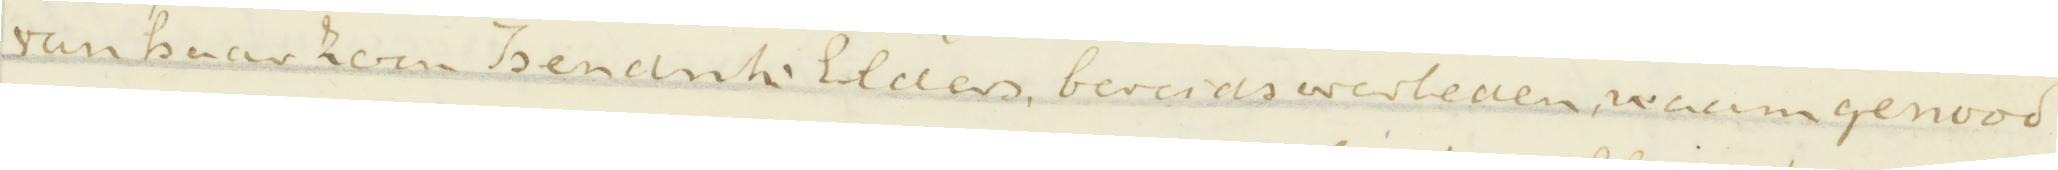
van haar zoon Hendrik Elders, bereids overleden, naam genood
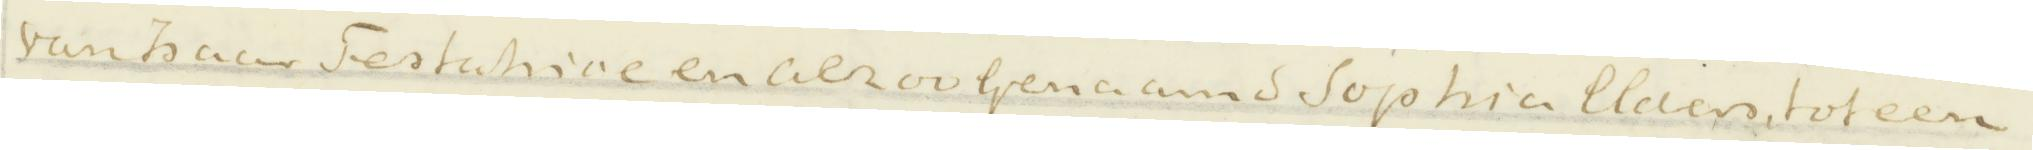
van haar Testatrice en alzoo Genaamd Sophia Elders, tot een
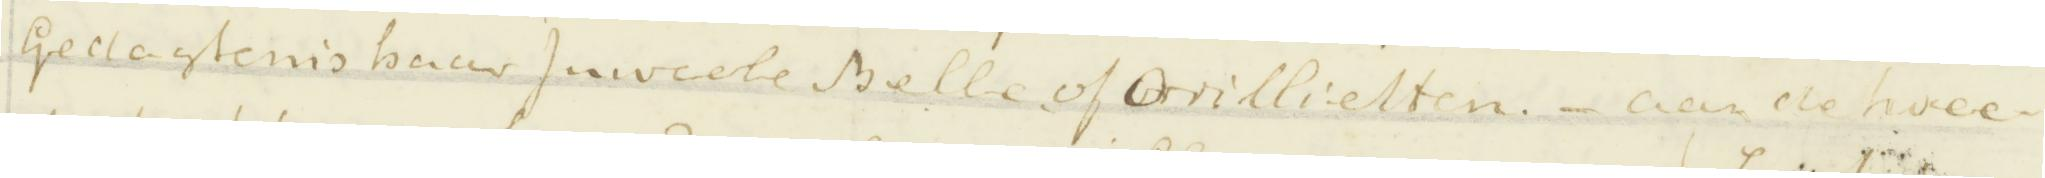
Gedagtenis haar Juweele Belle, of Orrillietten. – aan de twee-
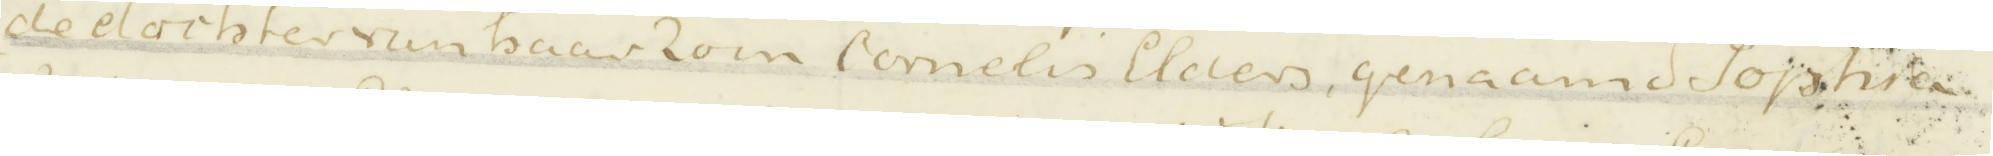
de dochter van haar zoon Cornelis Elders, genaamd Sophia
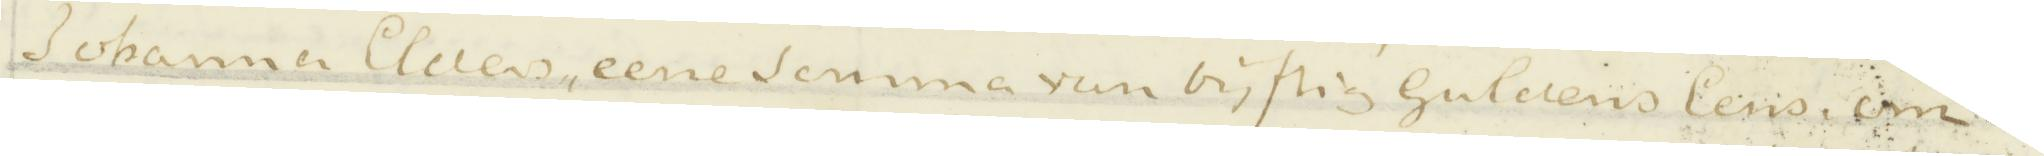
Johanna Claas, eene somma van vijftig Guldens Eens, om
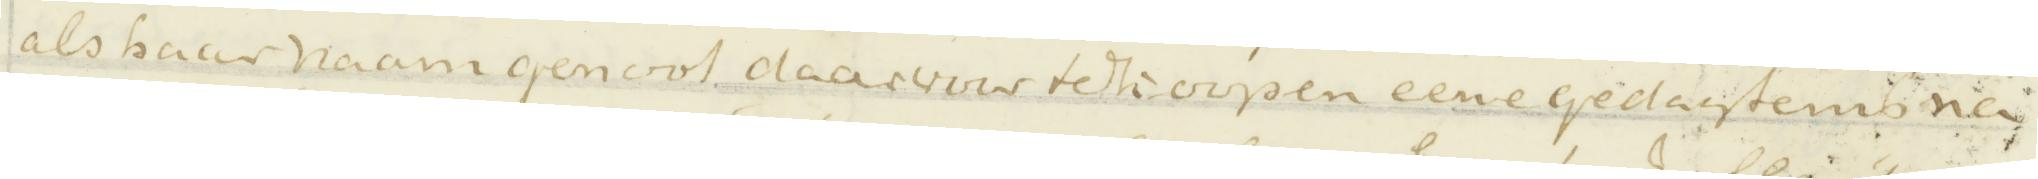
als haar naam genoot daar voor te koopen eene gedagtenis na
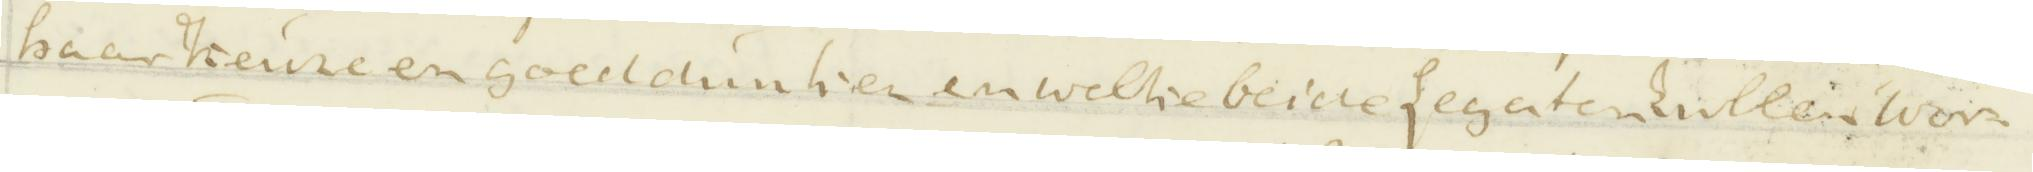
haar keuze en goeddunken en welke beide Legaten zullen wor-
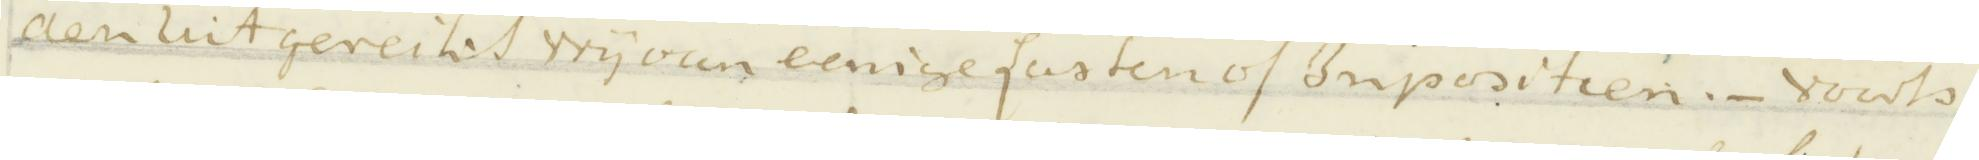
den uitgereikt vrij van eenige Lasten of Inpositien. – voorts
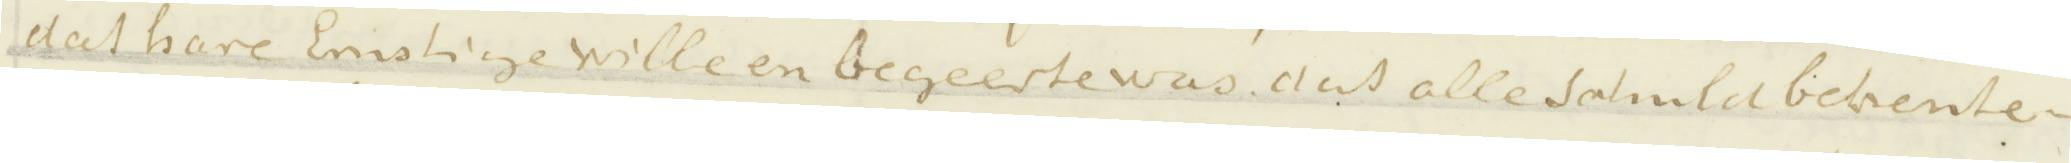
dat hare Ernstige wille en begeerte was, dat alle schuld bekente-
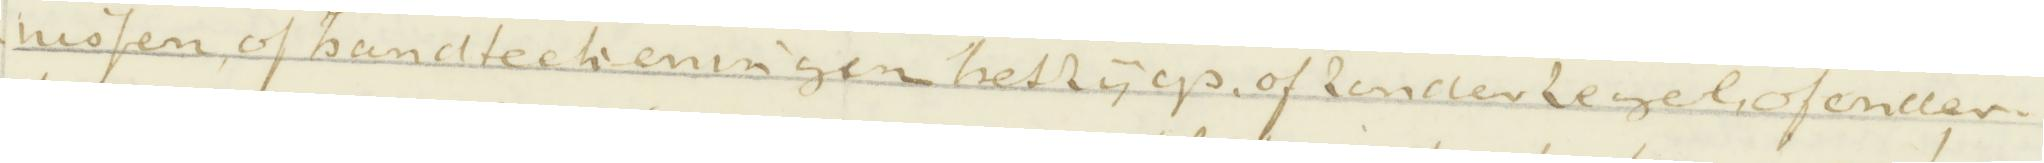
nissen, of handteekeningen het zij op, of zonder zegel, of onder-
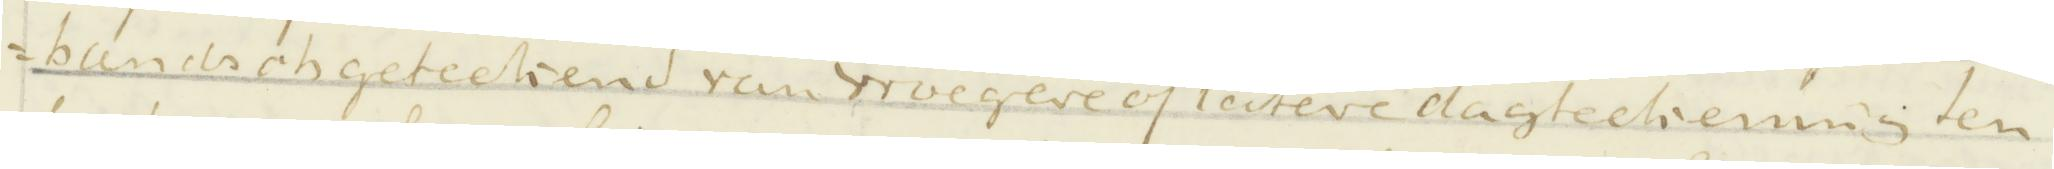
=handsch geteekend van vroegere of latere dagteekening ten
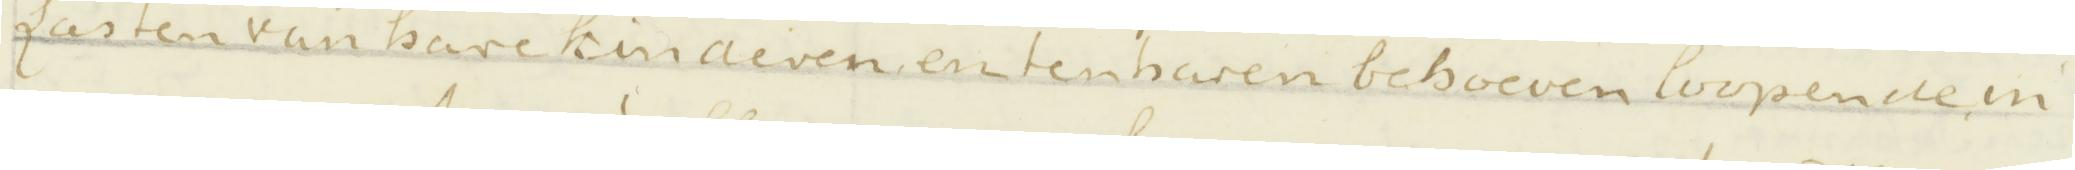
Lasten van hare kinderen en ten haren behoeven loopende, in
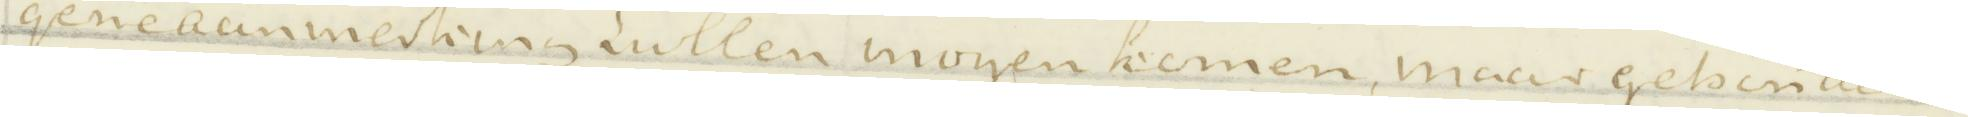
gene aanmerking zullen mogen komen, maar gehouden
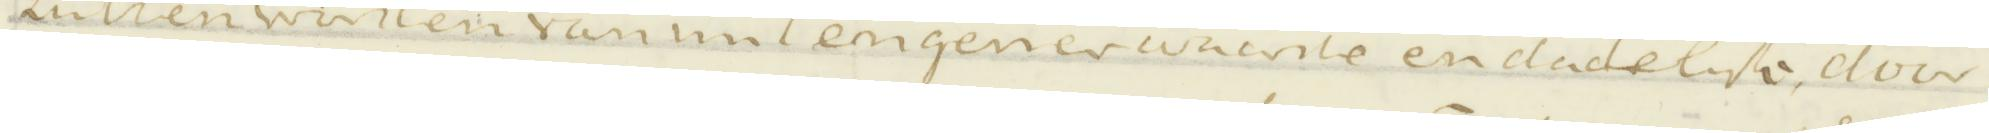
zullen worden van nul en gener waarde en dadelyk door
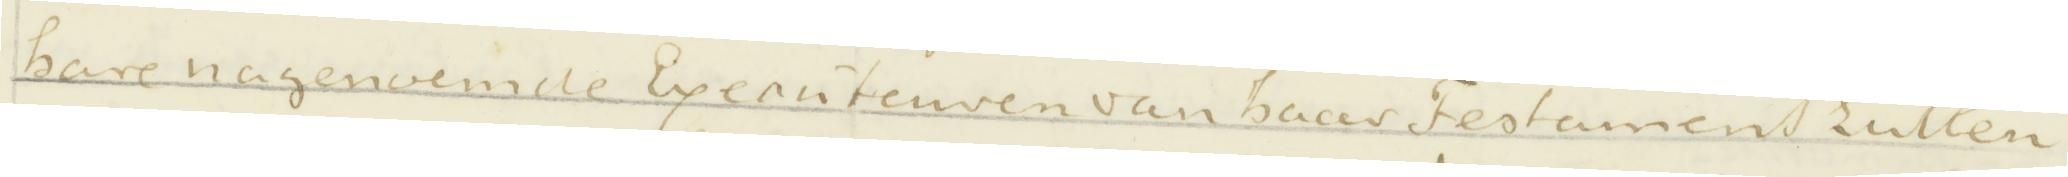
hare nagenoemde Executeuren van haar Testament zullen
